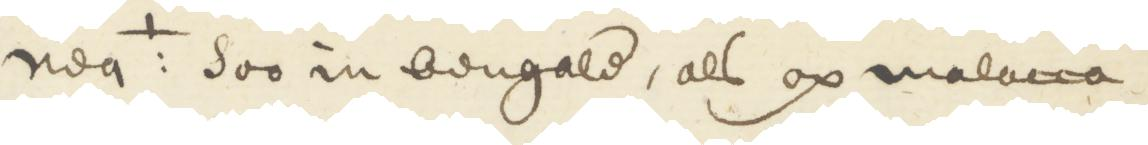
req:t soo in bengale, als op malacca
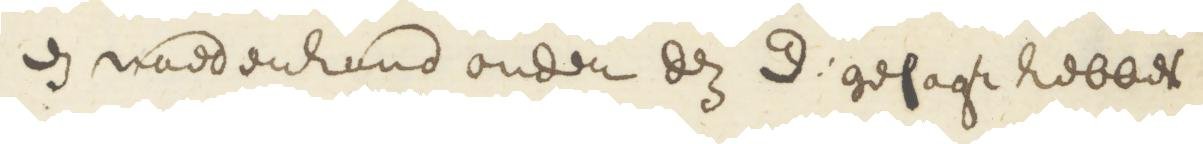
en raed en hand onder den E: gesagh hebber
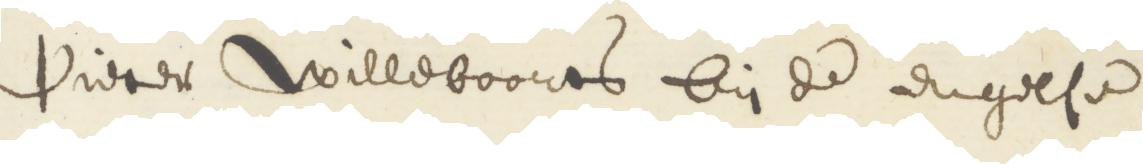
Pieter Willeboorts bij de engelse
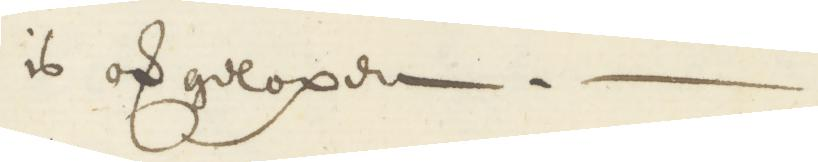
is overgelopen. —
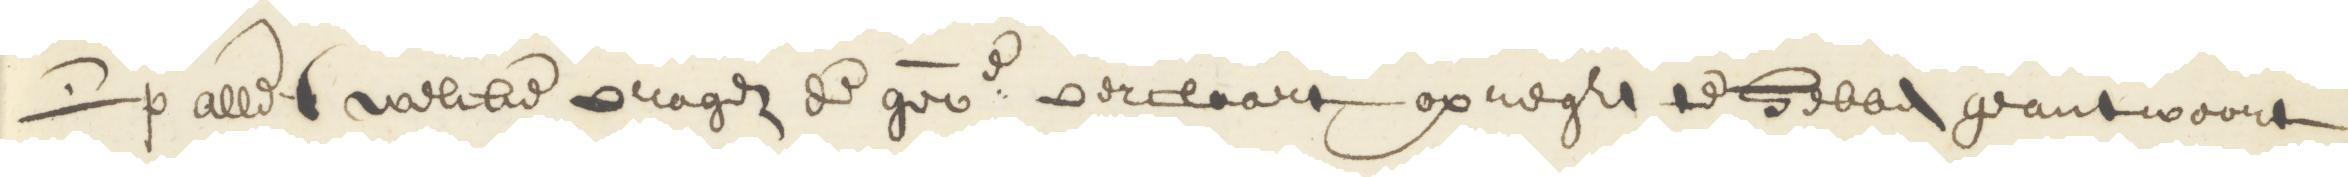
Op alle t welcke vragen de gev:e verclaart op reght te hebben geantwoort
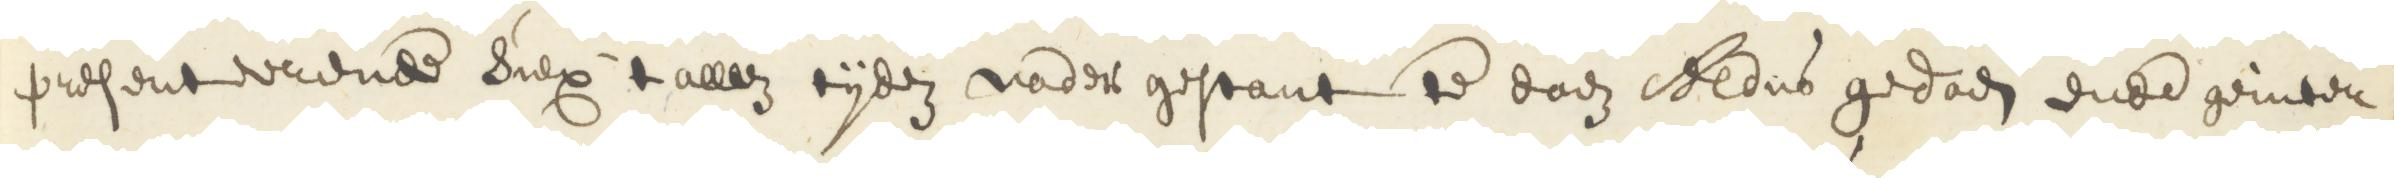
presenteerende sulx 't allen tijden nader gestant te doen Aldus gedaen ende geinter
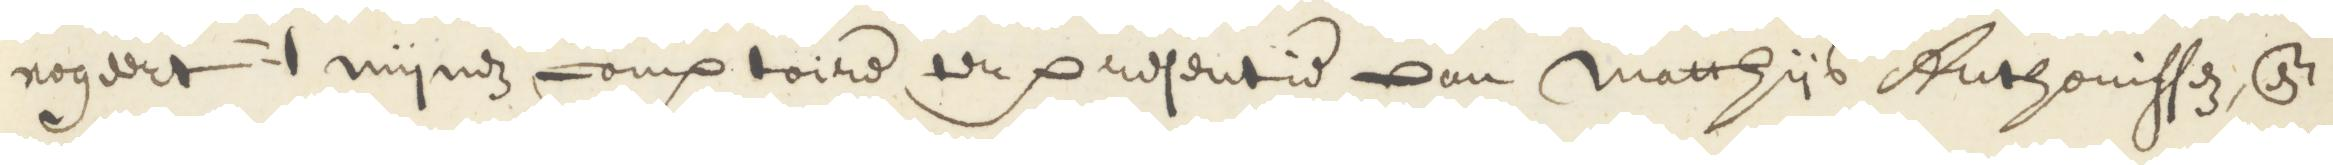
rogeert 't mijnen comptoire ter presentie van matthijs Anthonissen, ende
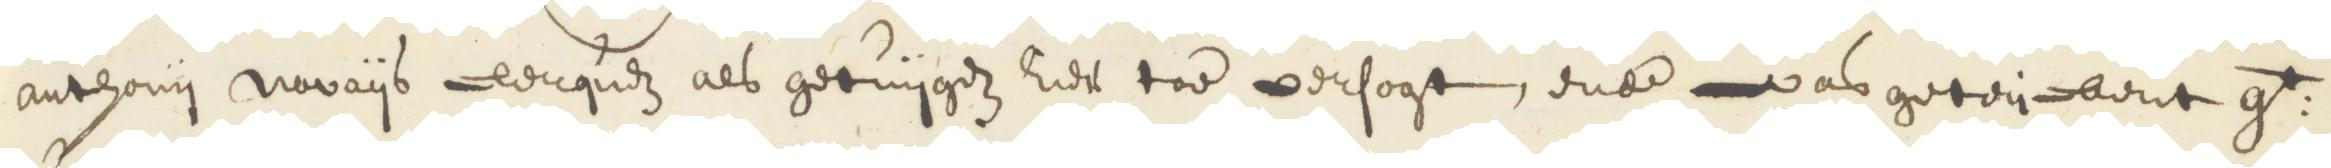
anthonij novaijs clerquen als getuijgen hier toe versogt, ende was geteijckent g:t
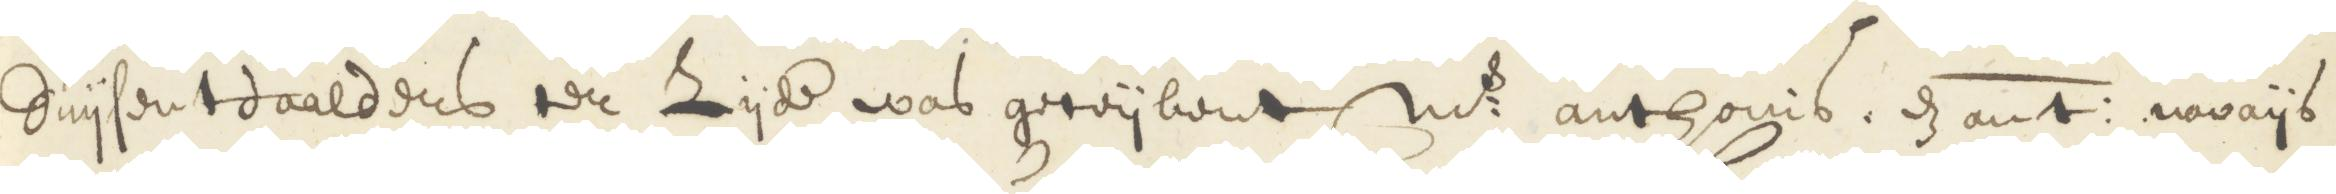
duijsentdaalders ter zijde was geteijkent m=s anthonis en ant: navaijs
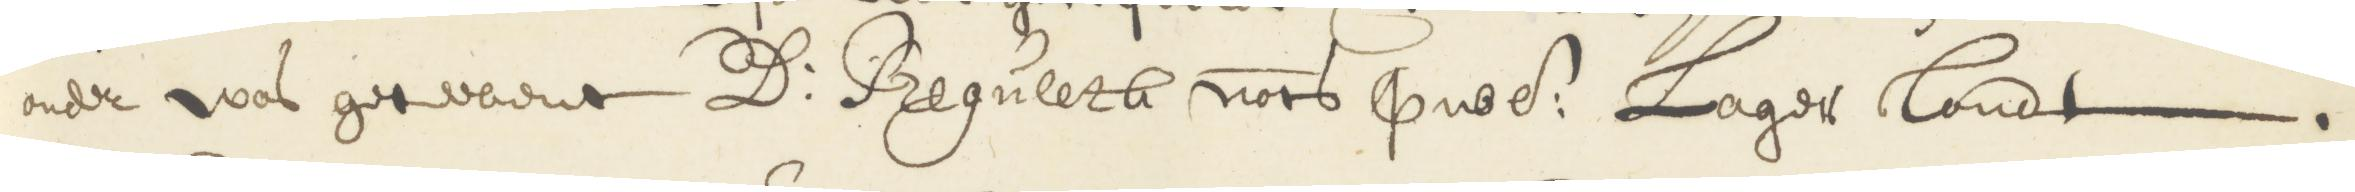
onder was geteekent D: Reguleth nots publijk Lager stondt.
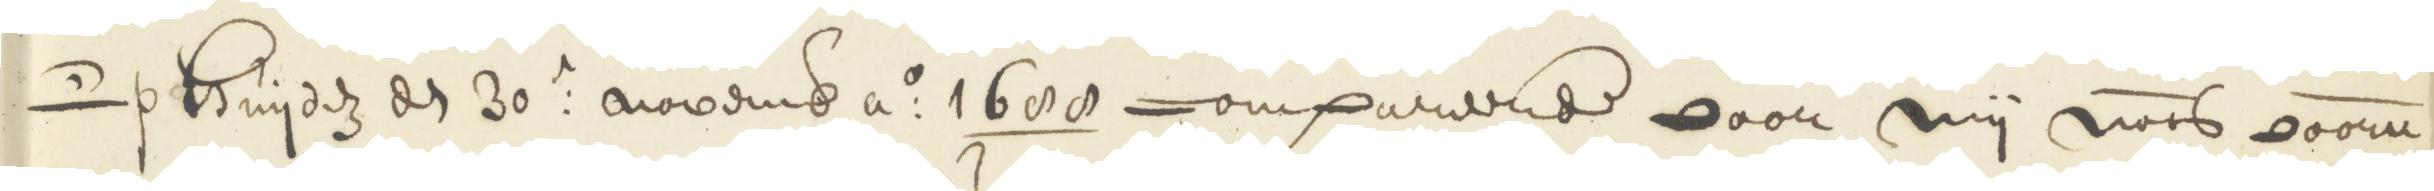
Op huijden den 30:en novemb a:o 1688 compareerde voor mij nots voorn
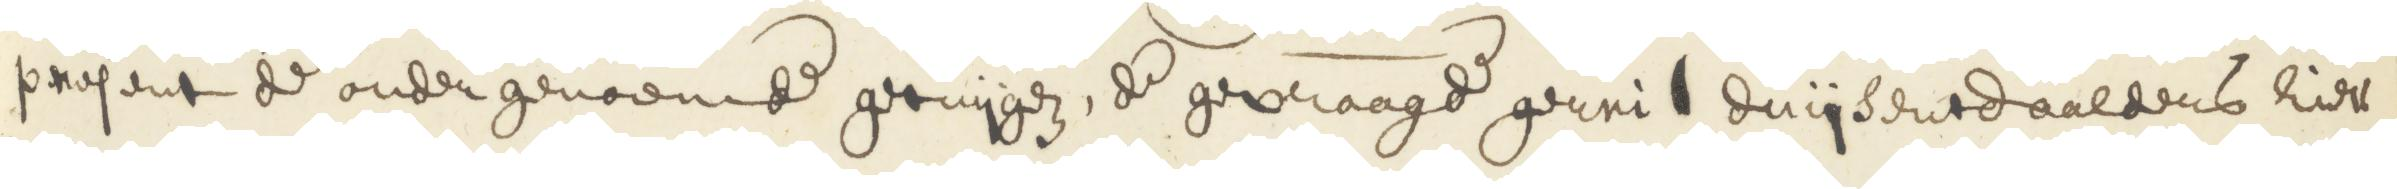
present de onder genoemde getuijgen, de gevraagde gerrit duijsentdaalders hier
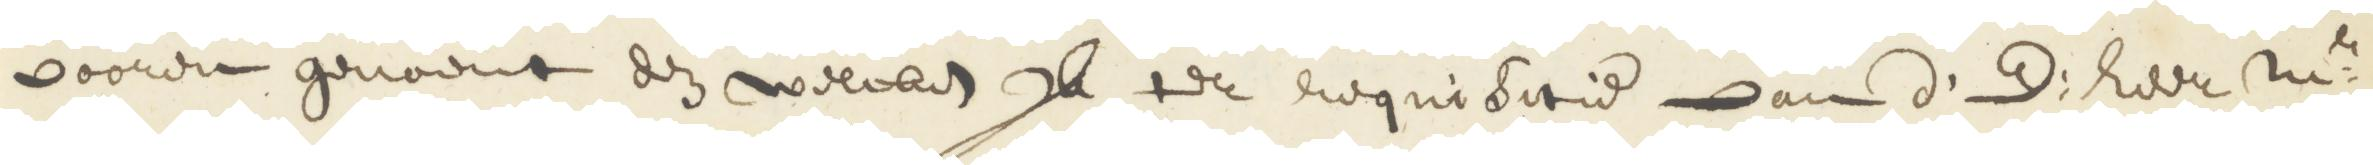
vooren genoemt den welcken Ik ter requisitie van d’ E: heer m:r
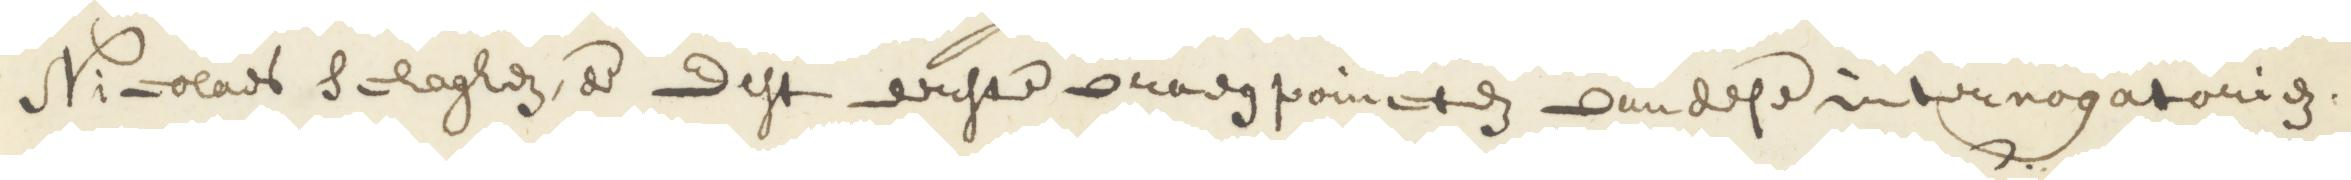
Nicolaes schaghen, de Eest eerste vraegpoincten van dese interrogatorien.
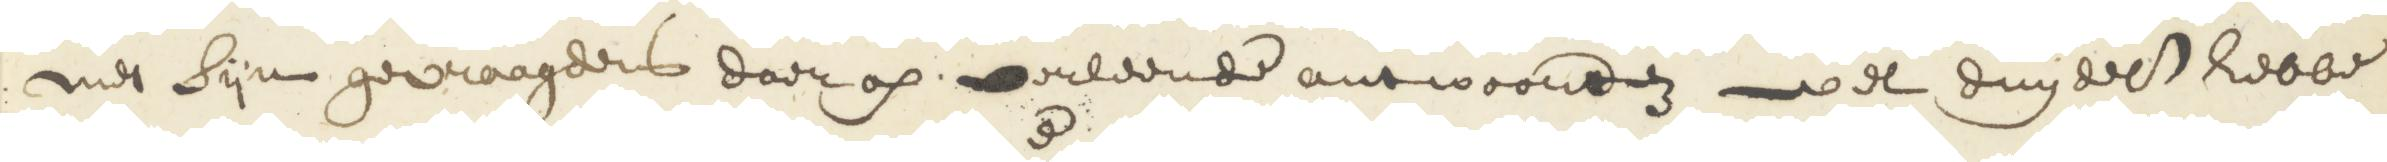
met sijn gevraagders daer op verleende antwoorden wel duijdelijk hebbe
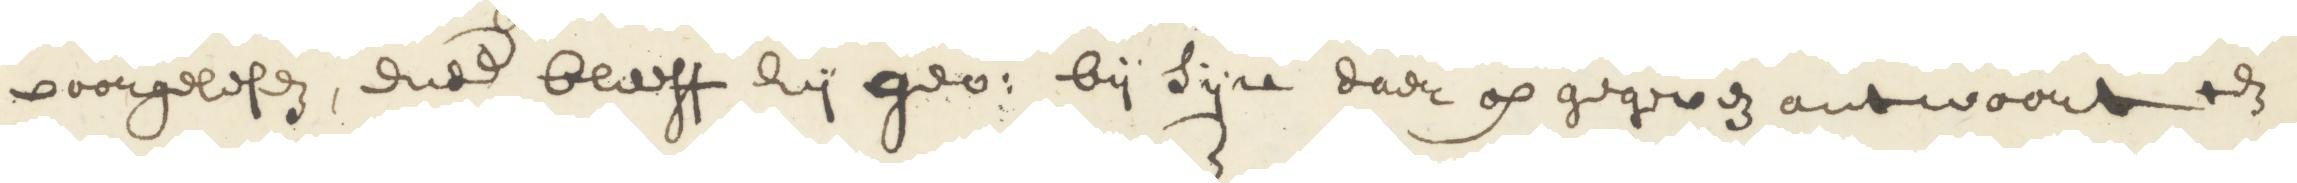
voorgelesen, ende bleeff hij gev:e bij sijn daer op gegeven antwoort en
